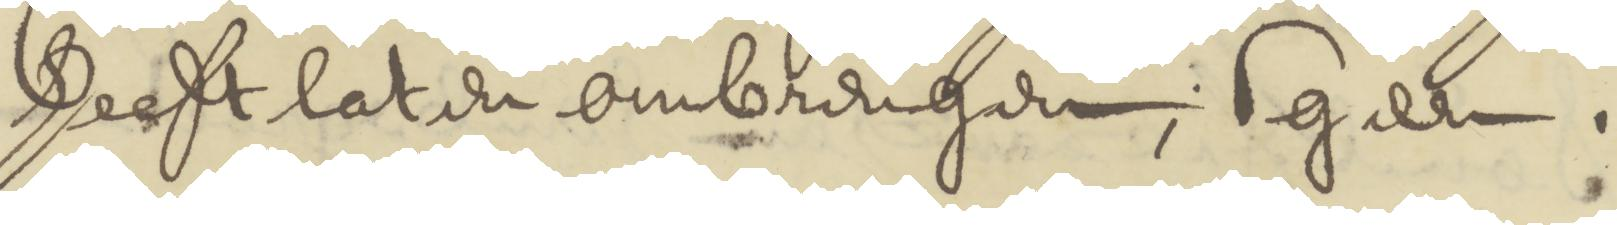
heeft laten ombrengen; tgeen.
